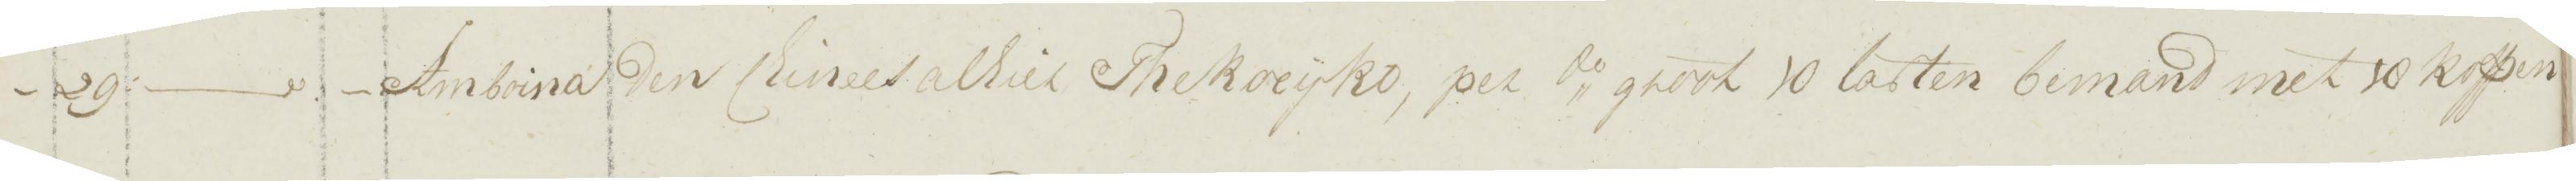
— 29: _o: — Amboina den Chinees alhier Thehoeijko, per d„o groot 10 lasten bemand met 10 koppen
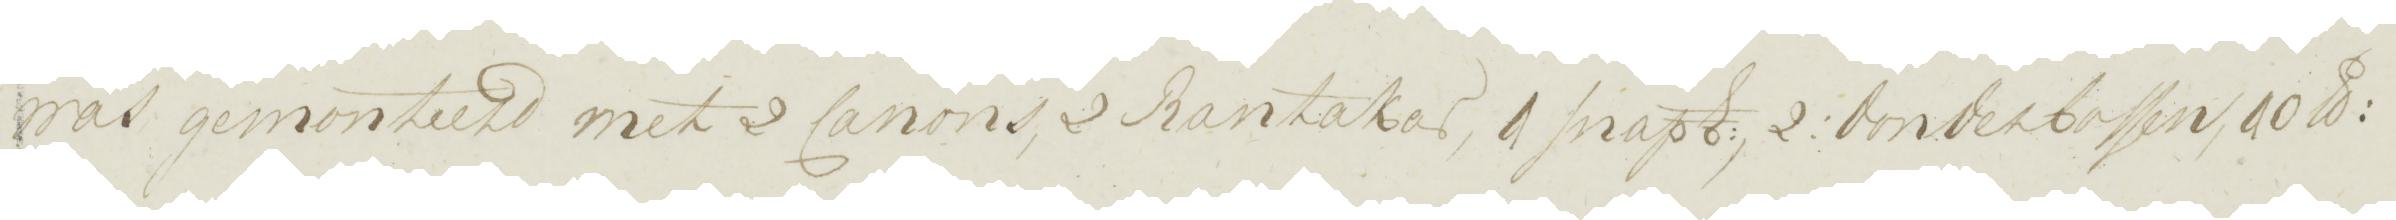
was gemonteerd met 2 Canons, 2 Rantakas, 4 snaph:, 2: donderbossen, 40 lb:
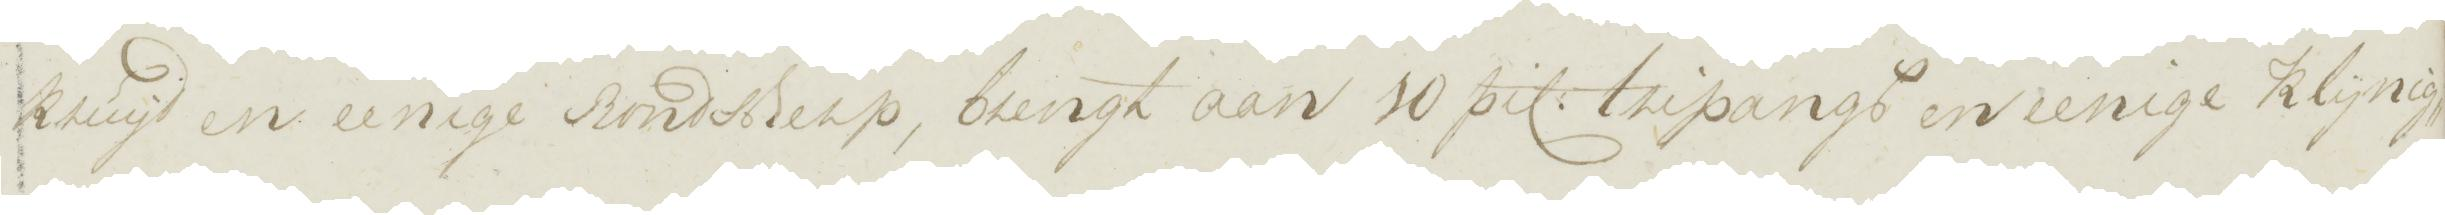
kruijd en eenige Rondscherp, brengt aan 10 pic: tripangs en eenige klijnig„
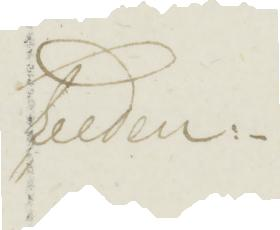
heeden. -
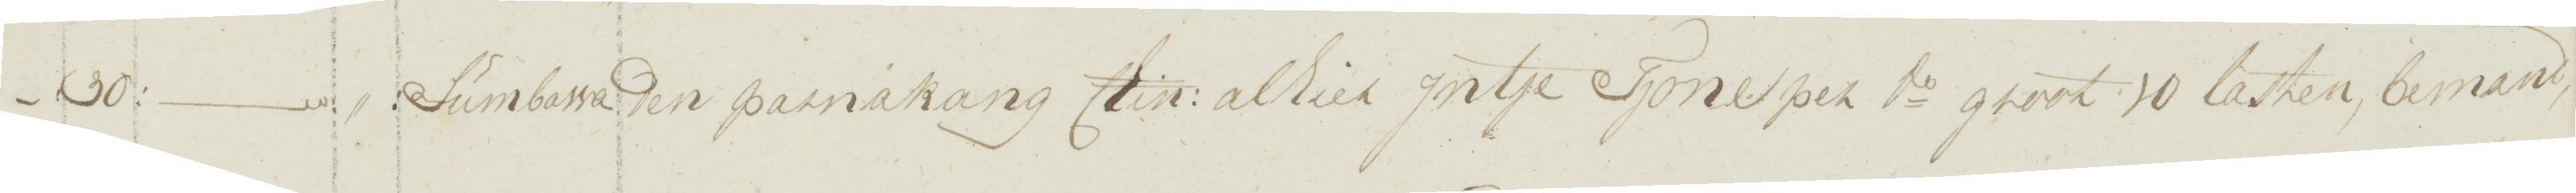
—: 30: _o: „ : Sumbawa den parnakang Chin: alhier Jntje Tjone per d=o groot 10 lasten, bemand,
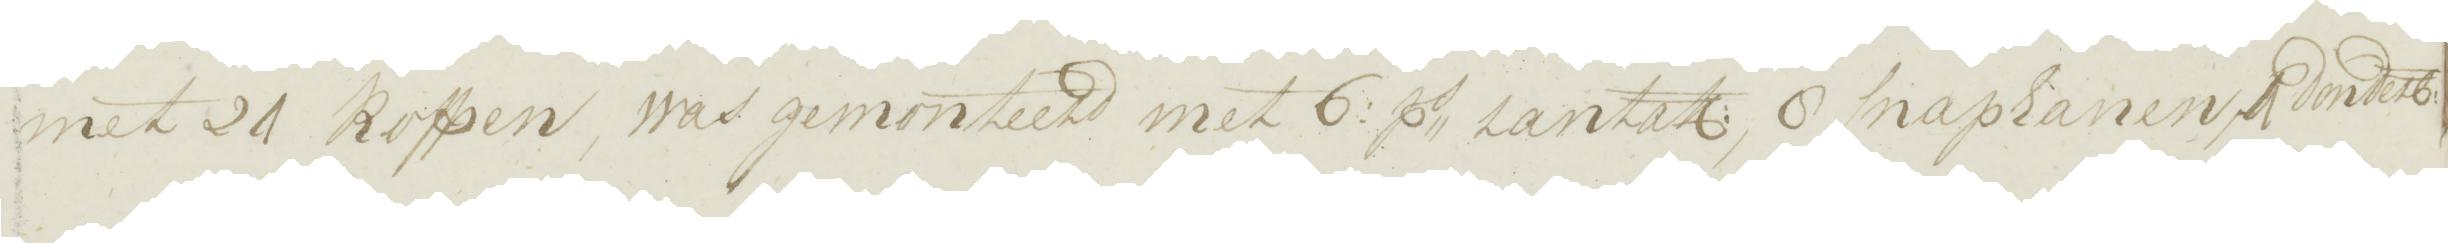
met 24 koppen, was gemonteerd met 6: p„s rantak:, 8 snaphanen, 4 donderb
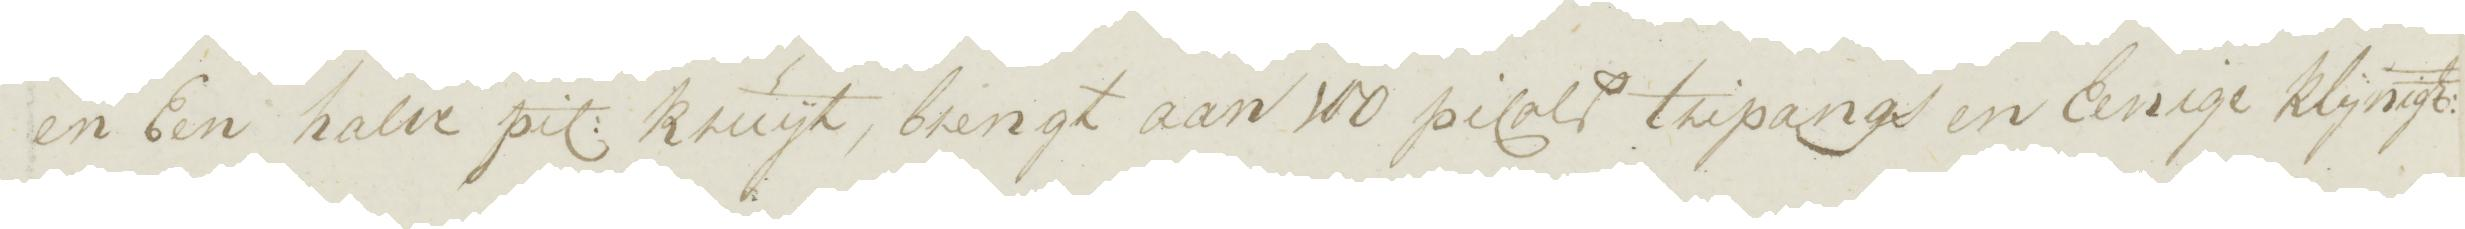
en Een halve pic: kruijt, brengt aan 100 picols tripangs en Eenige klijnigh
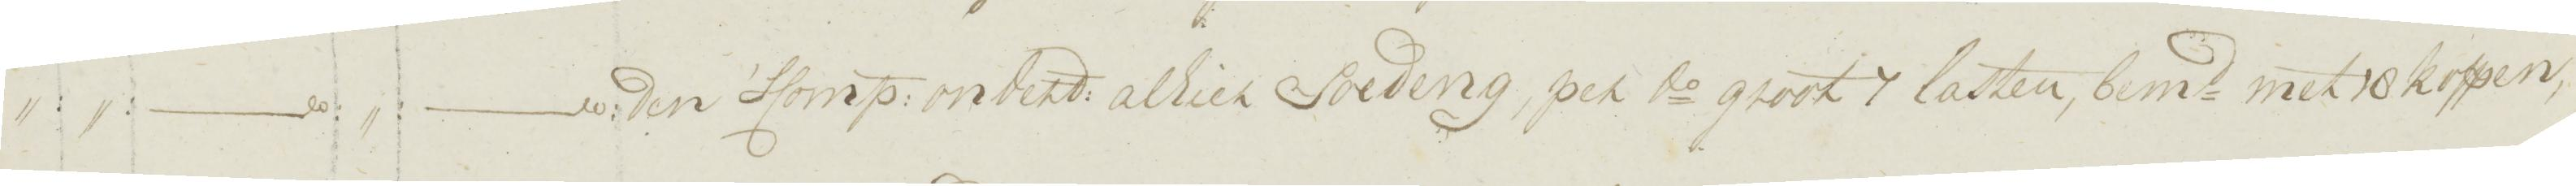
„ : „ : _o: „ : _o: den ’sComp: onderd: alhier Soedeng, per d=o groot 7 lasten, bem=d met 18 koppen,
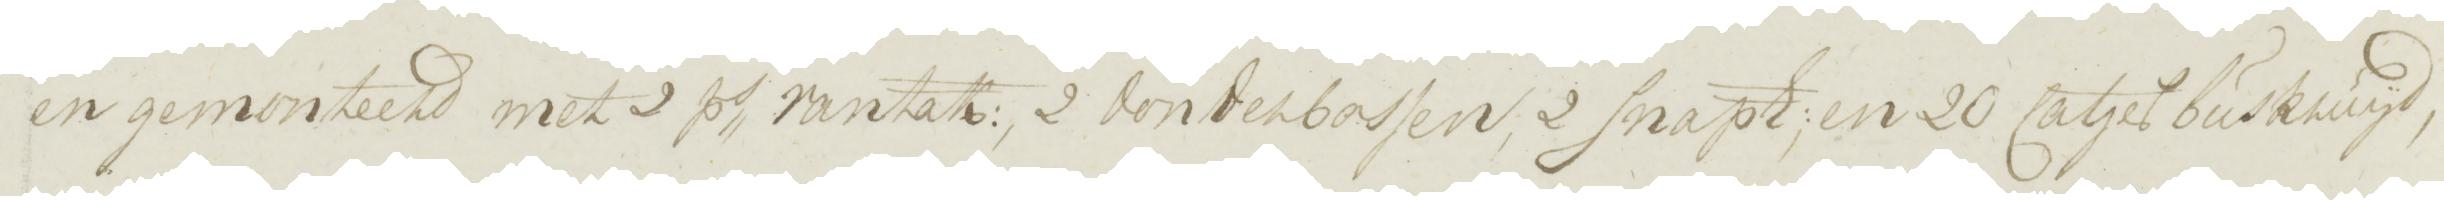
en gemonteerd met 2 p„s rantak:, 2 donderbossen, 2 snaph:, en 20 Catjes buskruijd,
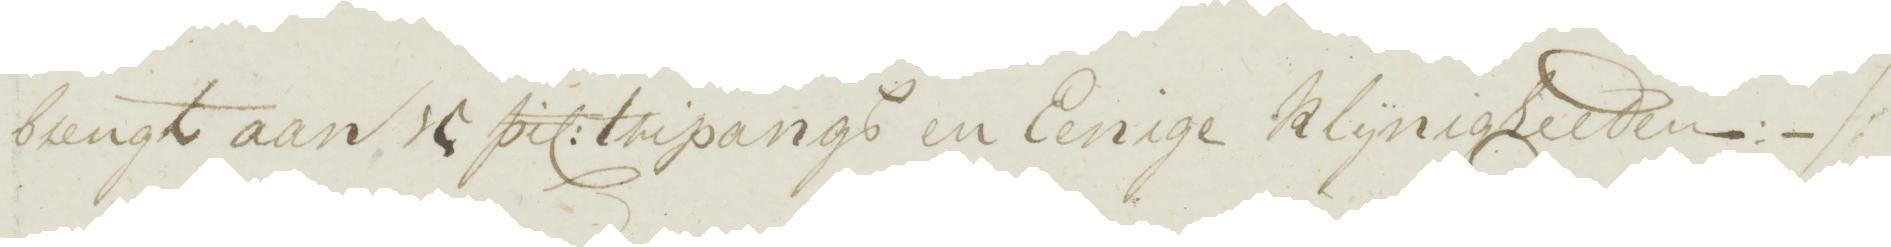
brengt aan 15 pic: tripangs en Eenige klijnigheeden: –
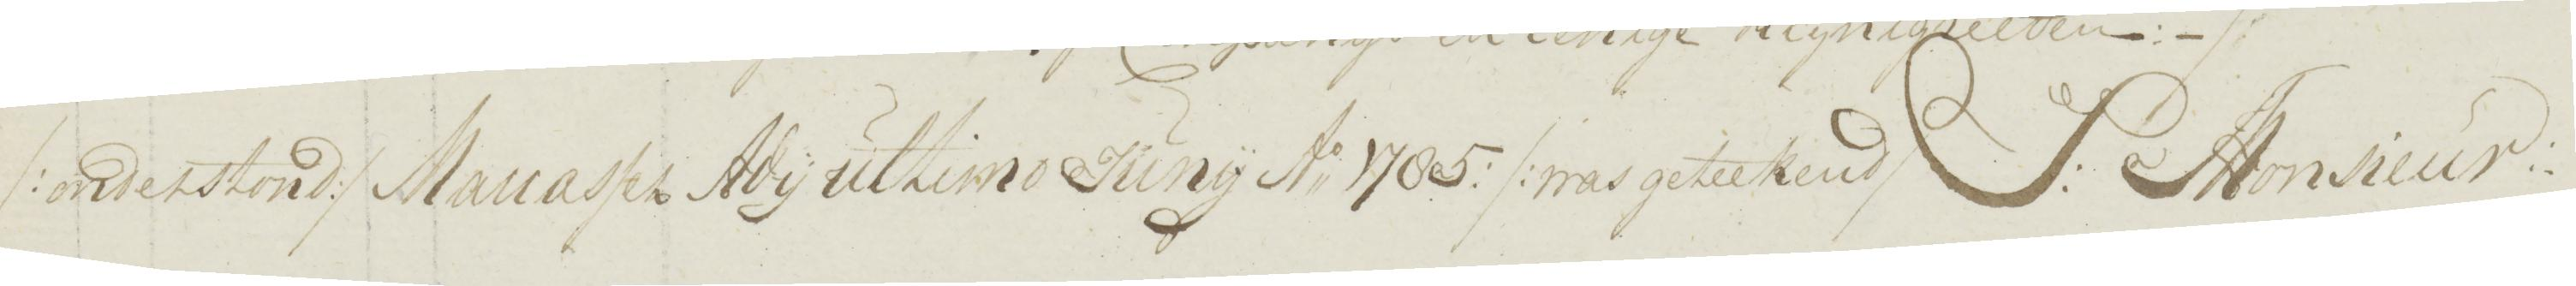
/: onderstond:/ Maccasser Adij ultimo Iunij A„o 1785: /: was geteekend/ S: Monsieur: -
